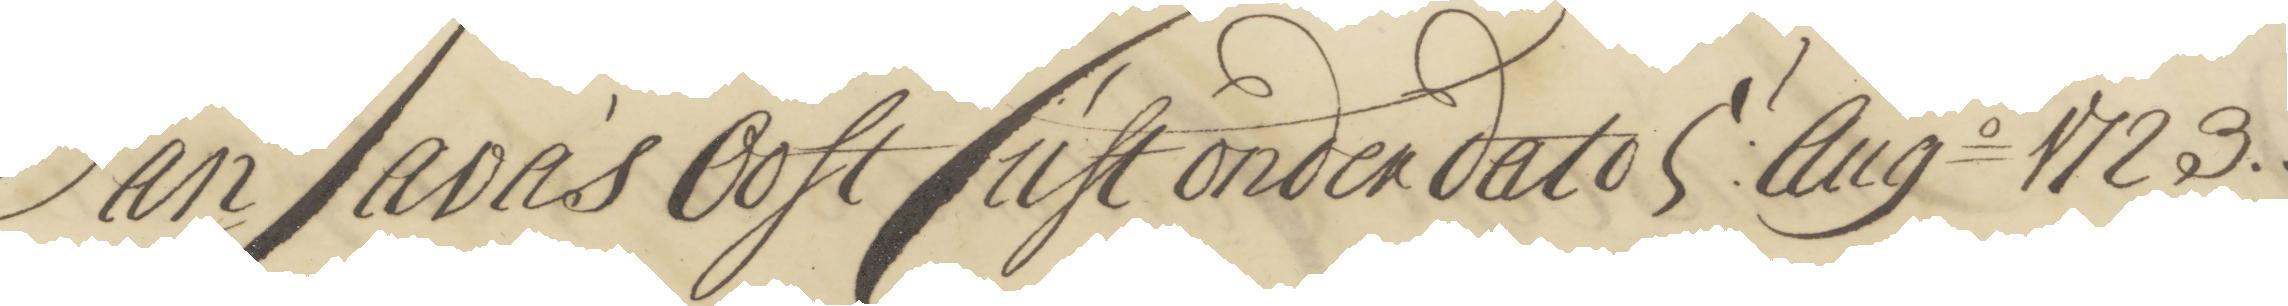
Van Java's Oost Cust onder dato 5:'Aug=o 1723.
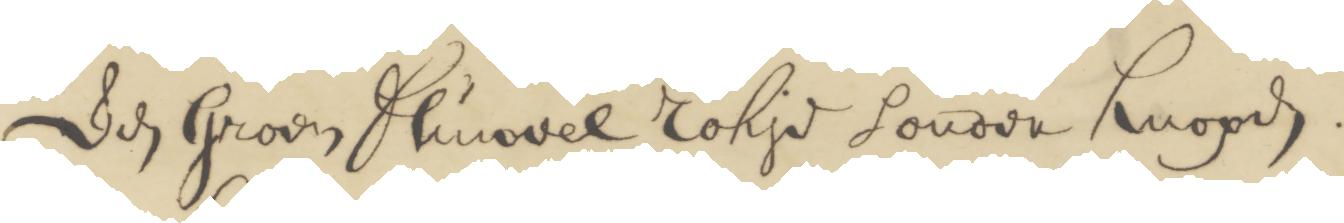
Een Groen fluweel rokje sonder knopen
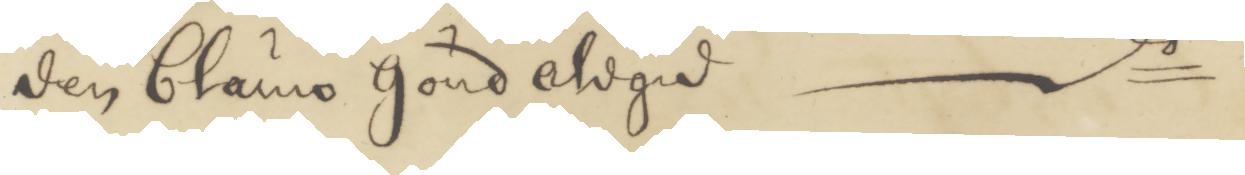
een blauw goud alegie d=o
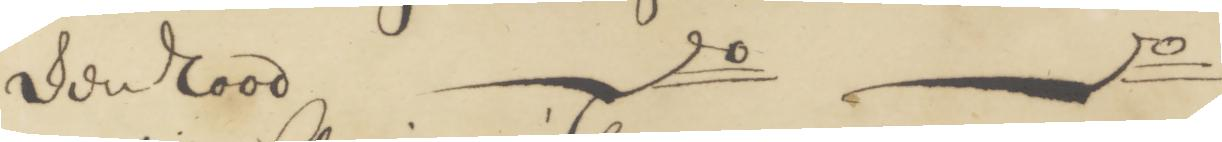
Een rood d=o d=o
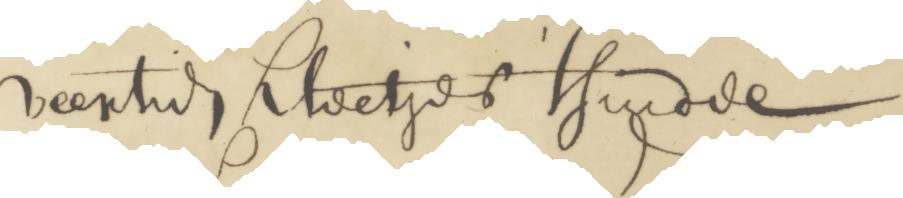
veertien kleetjes 't sindel
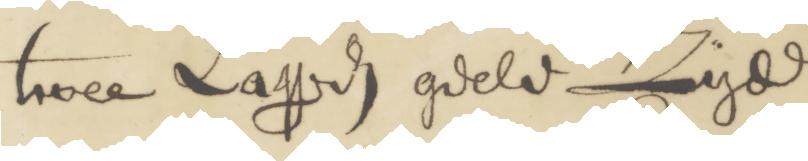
twee Lappen geele Zijde
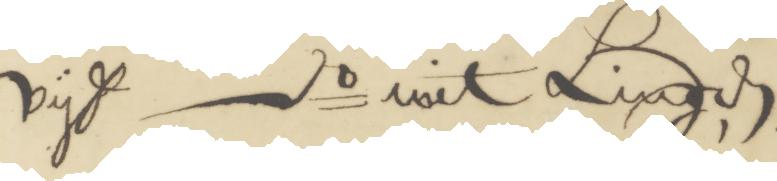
vijf d=o wit Linden
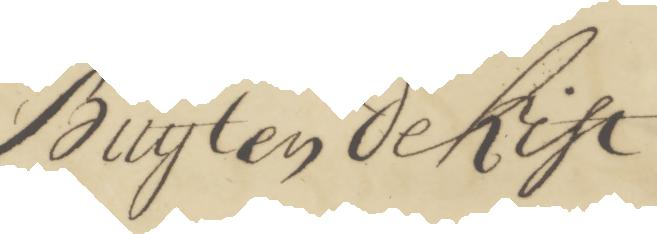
Buijten de kist
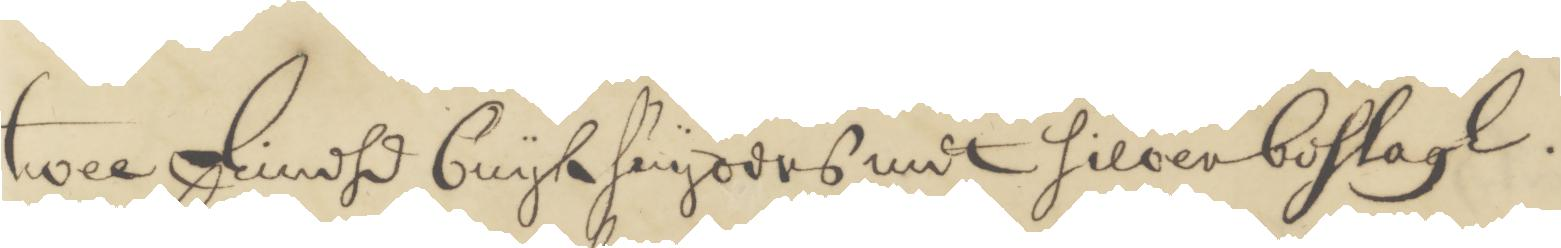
twee chinese buijk snijders met silver beslagh
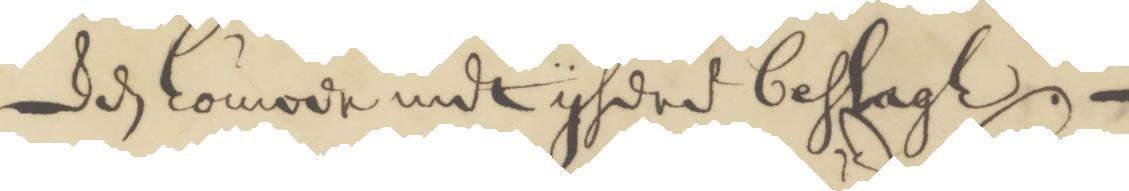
Een houwer met ijsere beslagh. —
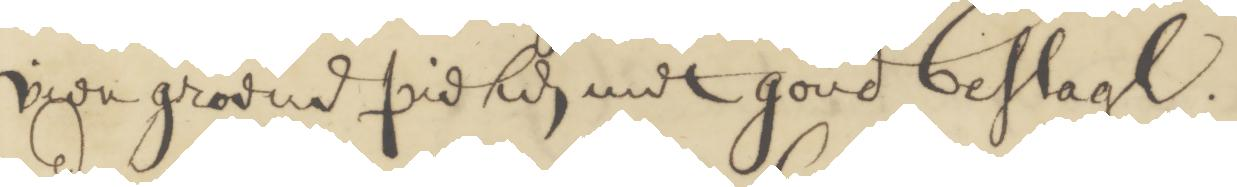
vier groene pieken met goud beslagh.
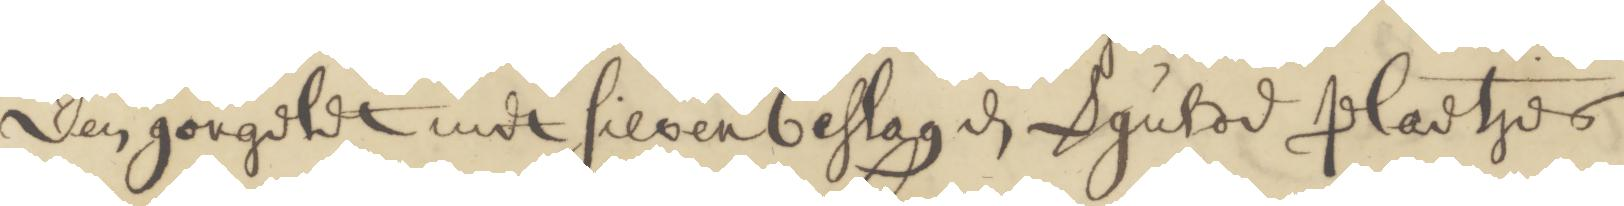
Een gorgelet met silver beslag en vergulde plaetjes
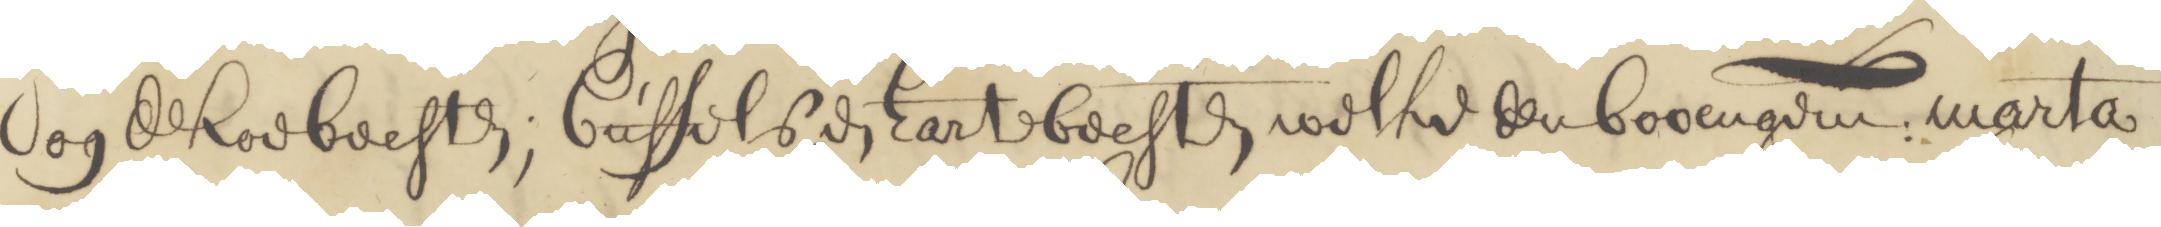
dog de koe beesten; buffels en hartbeesten welke den bovengem: marta
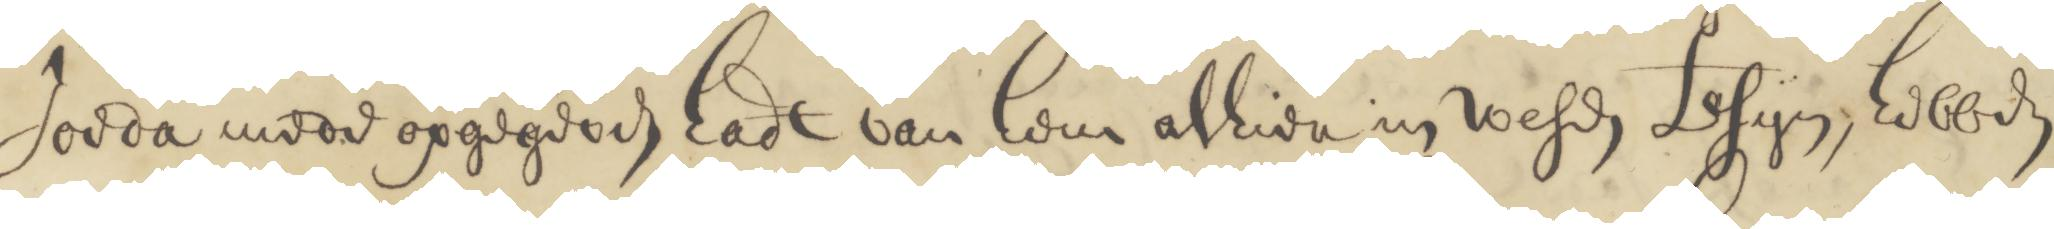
Joeda mede opgegeven hadt van hem alhier in wesen te sijn, hebben
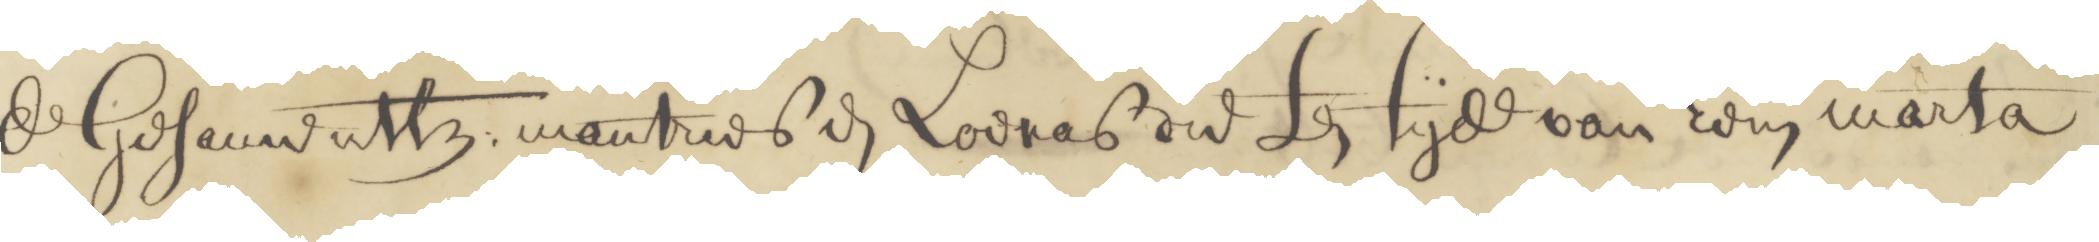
de Gesamentlijke mantries en Loeras die ten tijde van hem marta
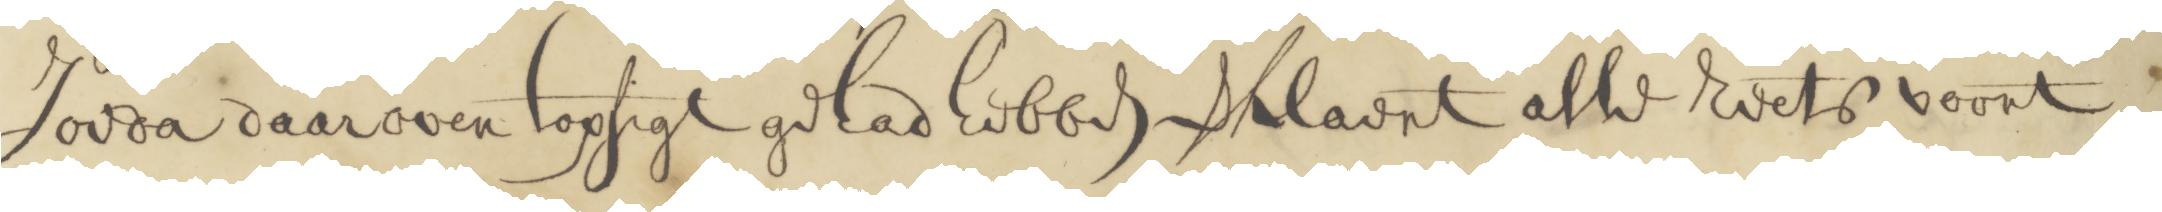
Joeda daar over t opsigt gehad hebben verklaert alle reets voort
